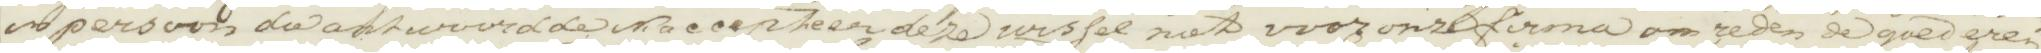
in persoon die antwoordde ik accepteer deze wissel niet voor onze firma om reden de goederen
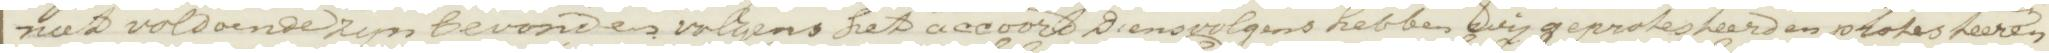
niet voldoende zyn bevonden volgens het accoord Diensvolgens hebben wij geprotesteerd en protesteeren
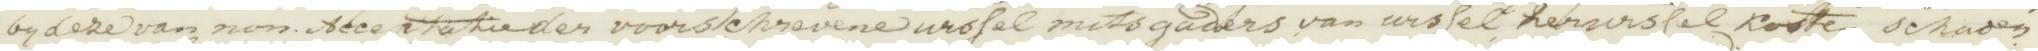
by deze van non Acceptatie der voorschrevene wissel mitsgaders van wissel herwissel kosten schaden
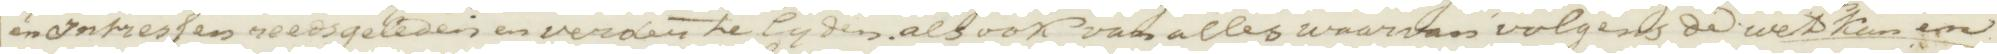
en Intressen reeds geleden en verder te lyden als ook van alles waarvan volgens de wet kan en
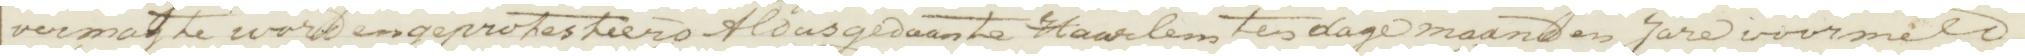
vermag te worden geprotesteerd Aldus gedaan te Haarlem ten dage maanden Jare voormeld
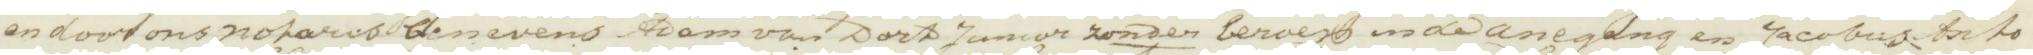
en door ons notaris benevens Adam van Dort Junior zonder beroep in de anegang en Jacobus Anto
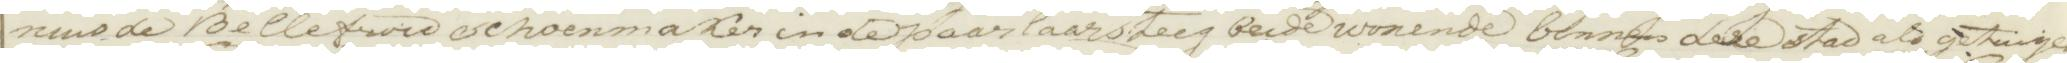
nius de Bellefroid schoenmaker in de paarlaarsteeg beide wonende binnen deze stad als getuigen
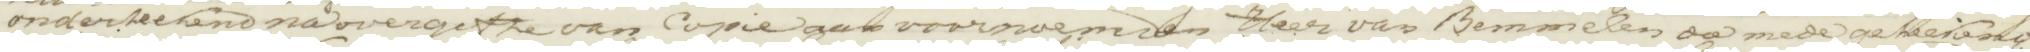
onderteekend na overgifte van Copie aan voornoemden Heer van Bemmelen de mede geteekend
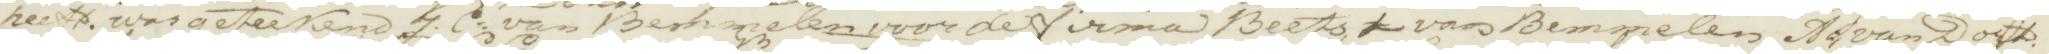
heeft. was geteekend J. C: van Bemmelen voor de firma Beets & van Bemmelen A„ van Dort.
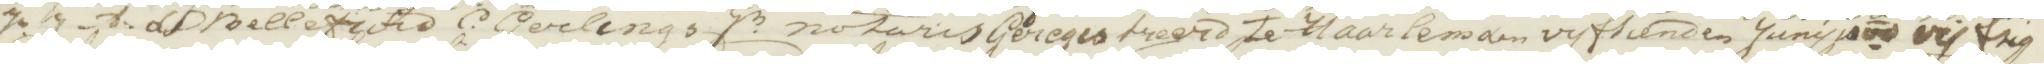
J. J. A. de Bellefroid C Gerlings J.r notaris Geregistreerd te Haarlem den vyftienden Juny 1800 vijftig
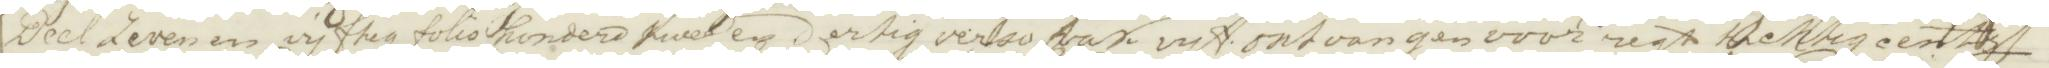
Deel zeven en vijftig folio honderd twee en dertig verso vak vyf ontvangen voor regt tachtig cents
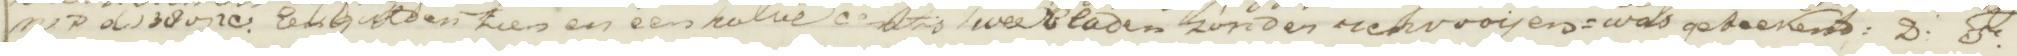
met de 38 opc. Een gulden tien en een halve cents twee bladen zonder renvooijen = was geteekend: D: F.
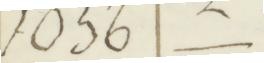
1056 2/2
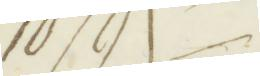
1079 3/16
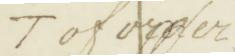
T of order
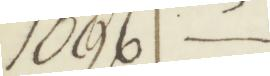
1096 5/16
